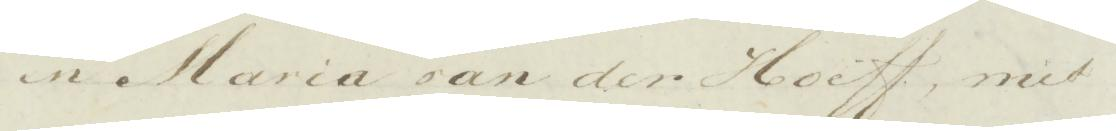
en Maria van der Hoeff, met
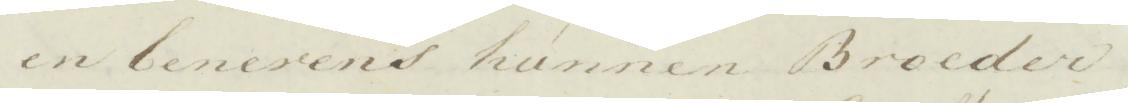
en benevens hunnen Broeder
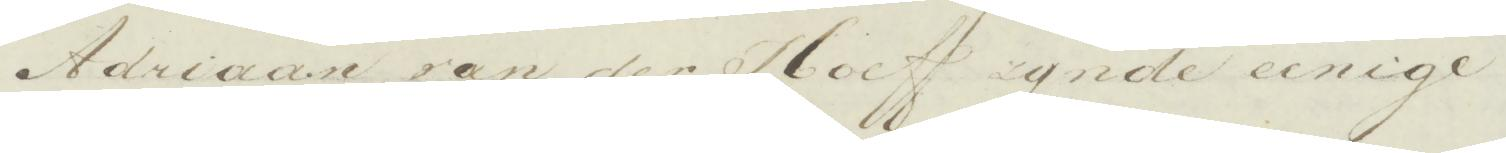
Adriaan van der Hoeff zynde eenige
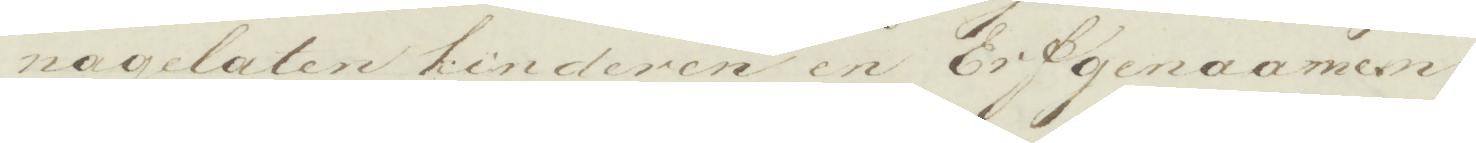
nagelaten kinderen en Erfgenaamen
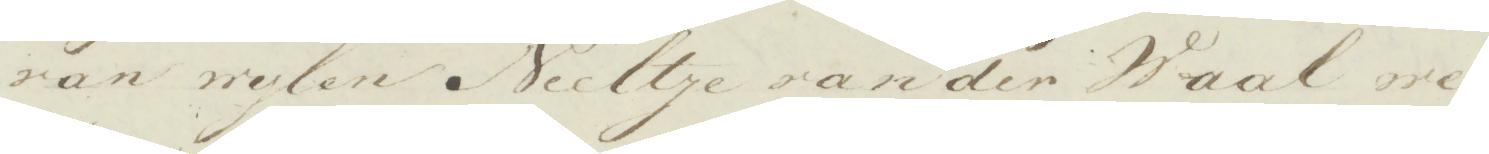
van wylen Neeltje van der Waal we
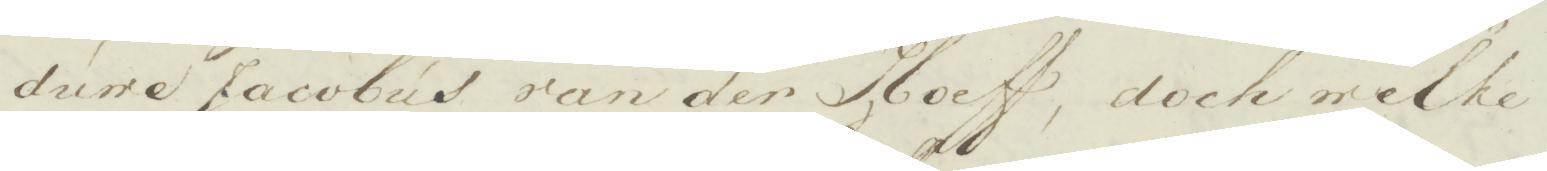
duwe Jacobus van der Hoeff, doch welke
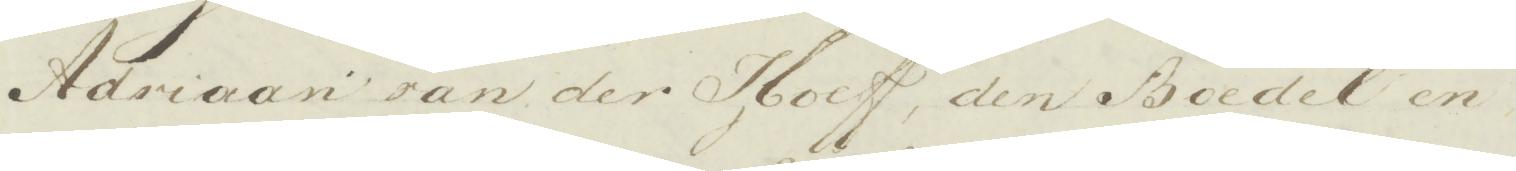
Adriaan van der Hoeff, den Boedel en
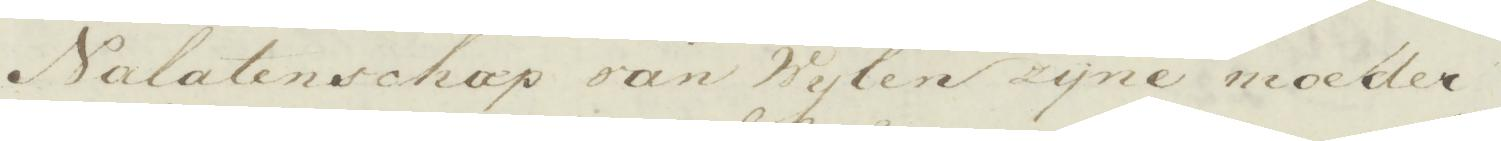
Nalatenschap van Wylen zijne moeder
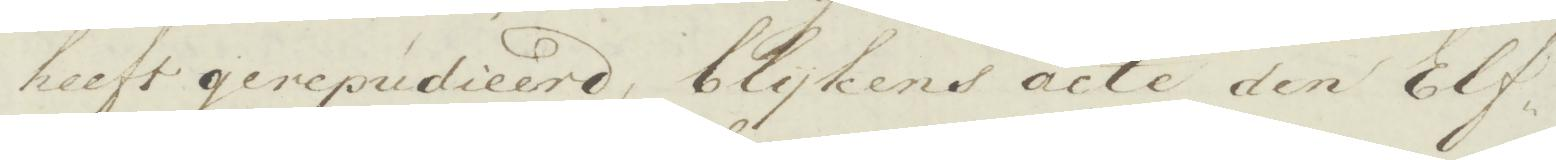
heeft gerepudieerd, blijkens acte den Elf„
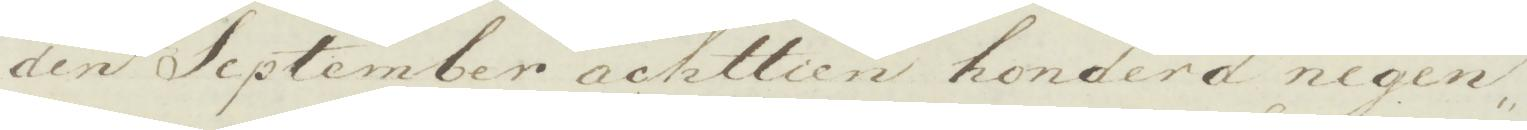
den September achttien honderd negen
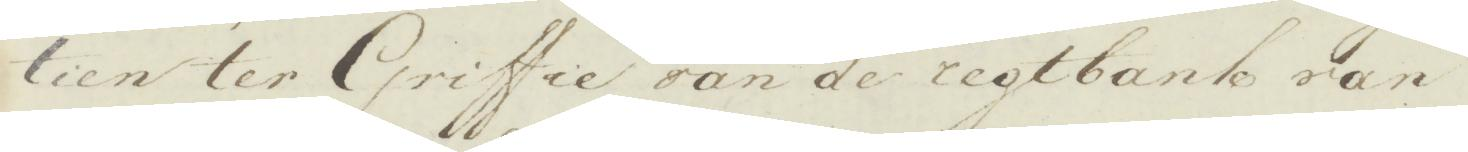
tien ter Griffie van de regtbank van
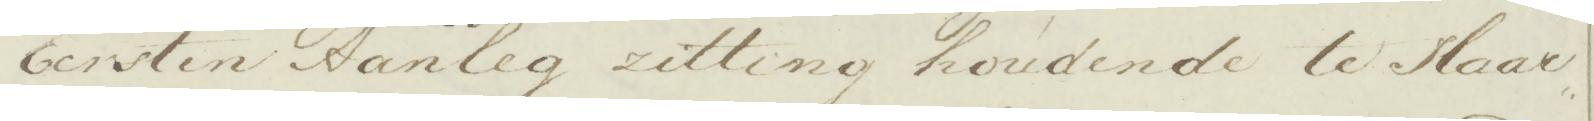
Eersten Aanleg zitting houdende te Haar„
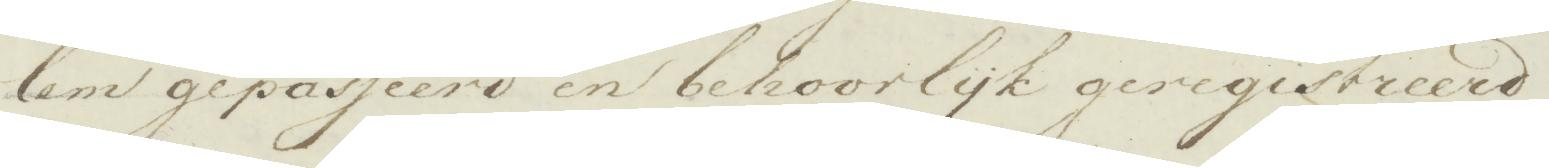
„lem gepasseerd en behoorlijk geregistreerd
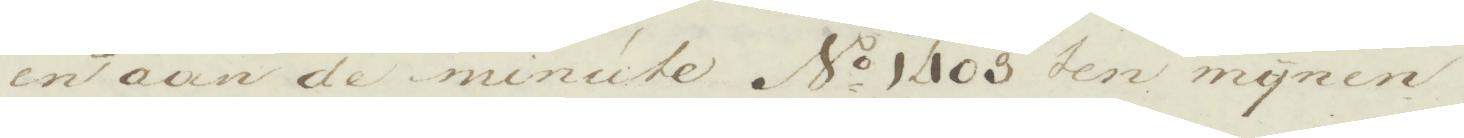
en aan de minute N=o 1403 ten mijnen
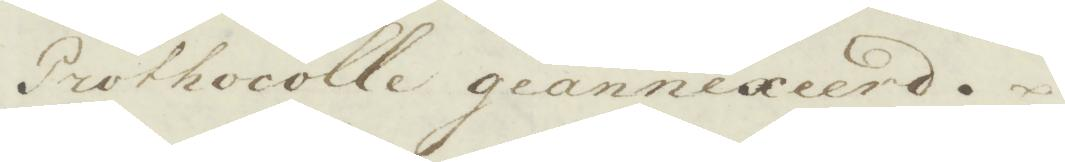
Prothocolle geannexeerd.
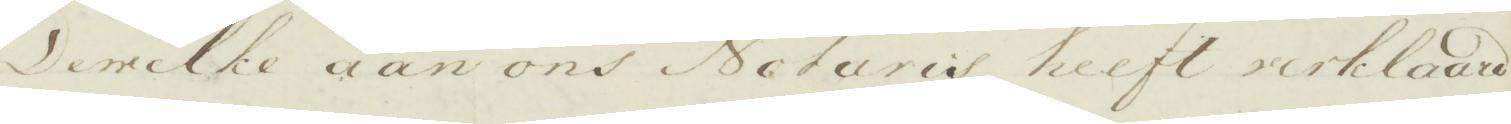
Dewelke aan ons Notaris heeft verklaard
